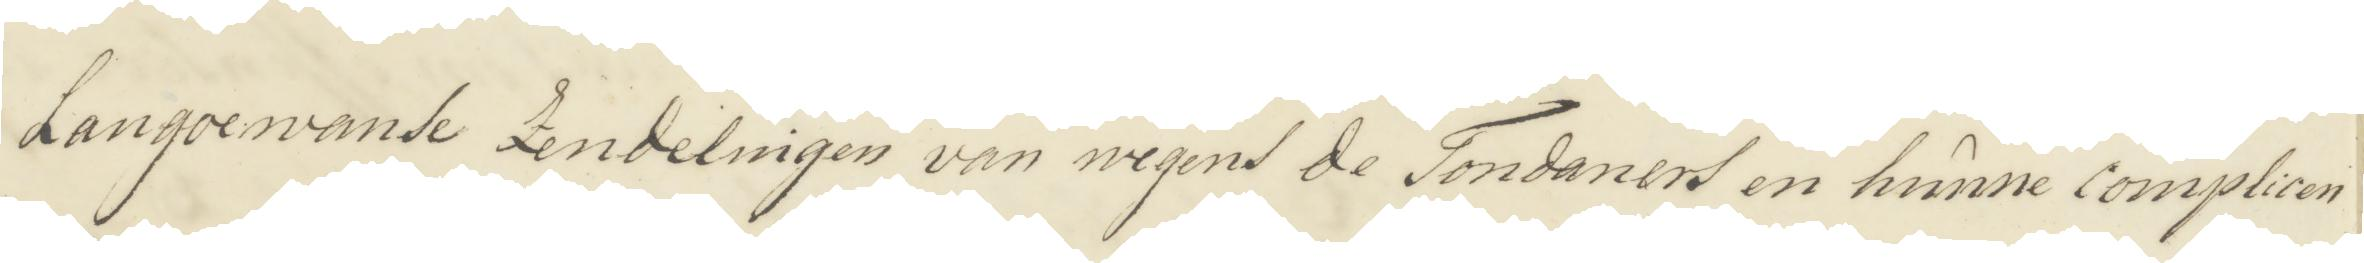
Langoewanse zendelingen van wegens de Tondaners en hunne complicen
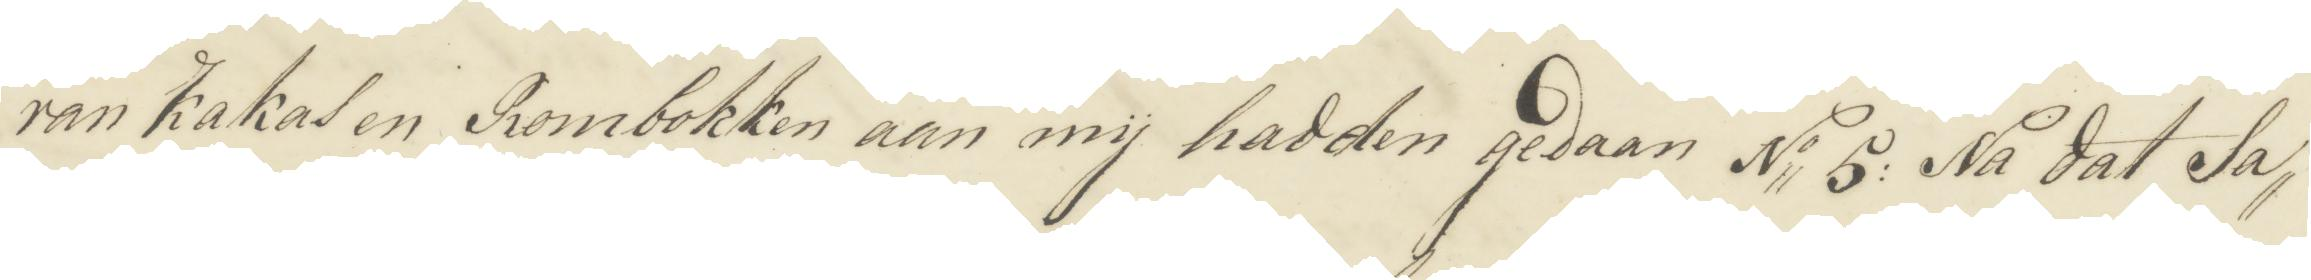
van Kakas en Rombokken aan mij hadden gedaan N„o 5: Na dat Sa
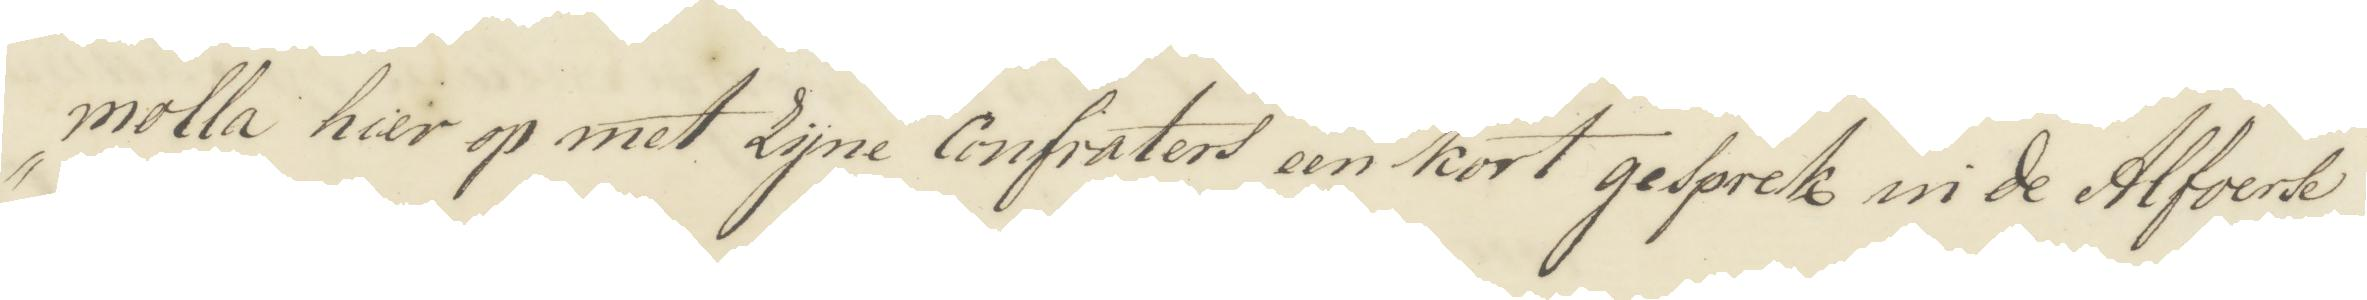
„molla hier op met zijne confraters een kort gesprek in de Alfoerse
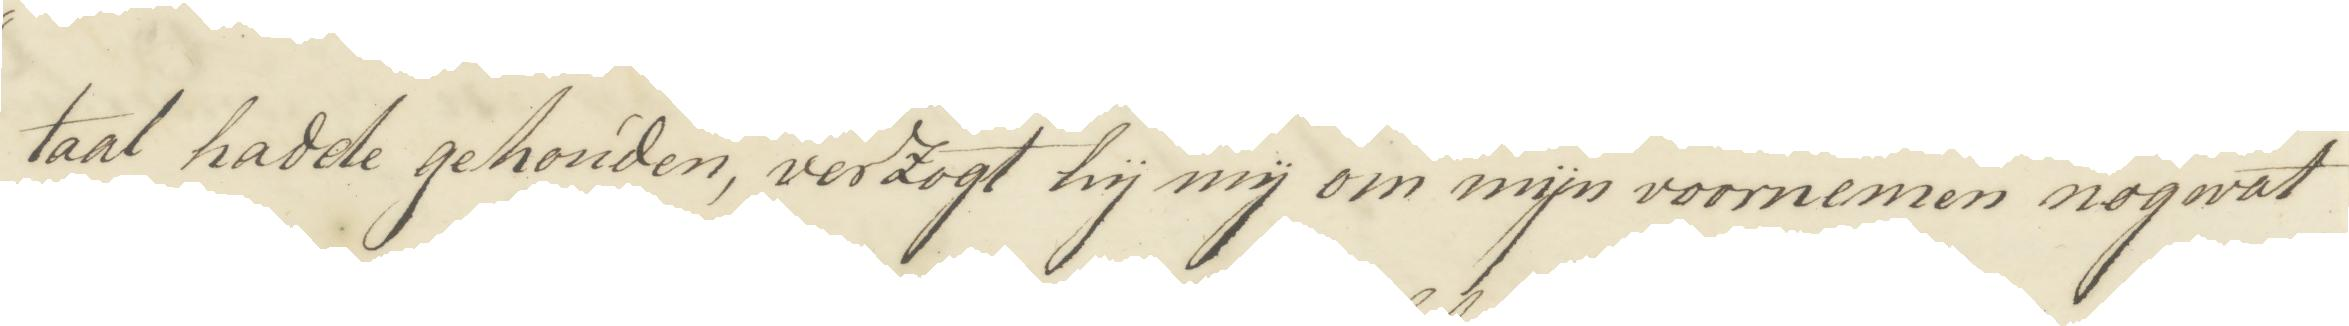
taal hadde gehouden, verzogt hij mij om mijn voornemen nog wat
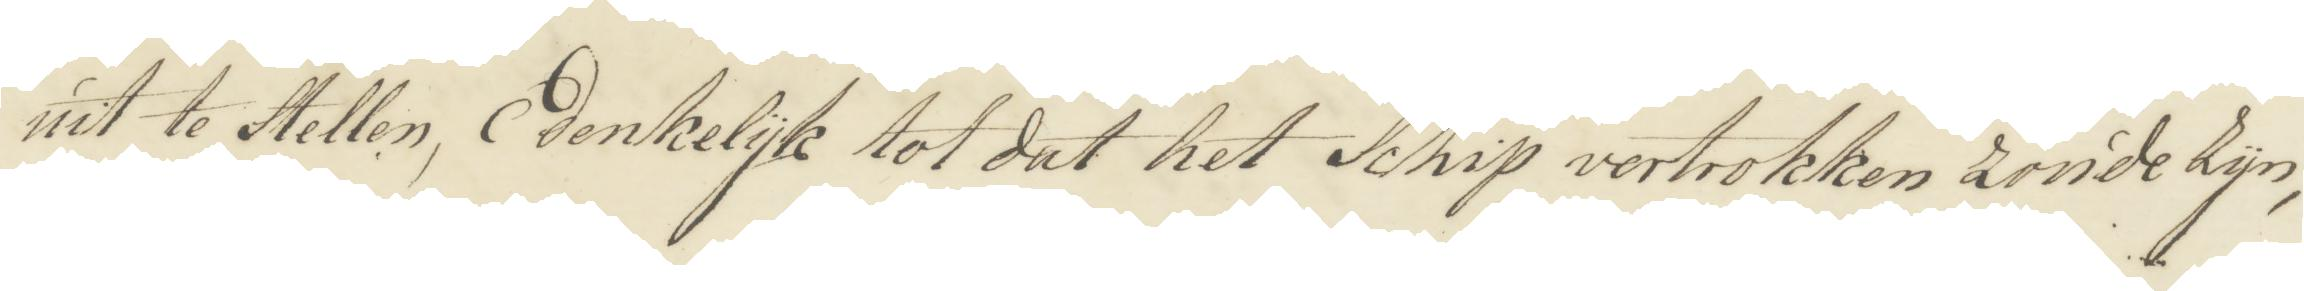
uit te stellen, ( denkelijk tot dat het schip vertrokken zoude zijn
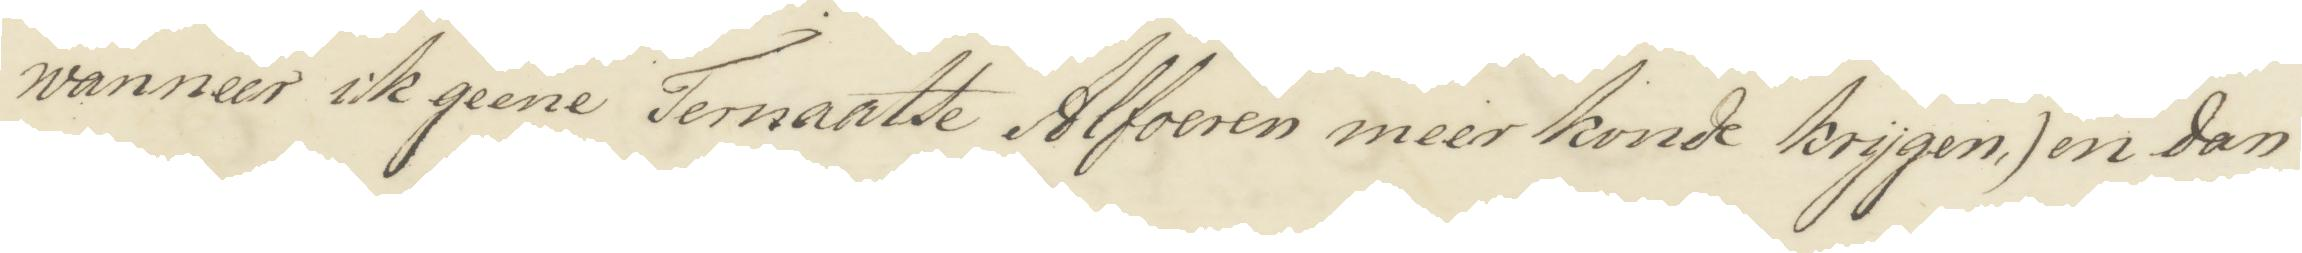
wanneer ik geene Ternaatse Alfoeren meer konde krijgen, ) en dan
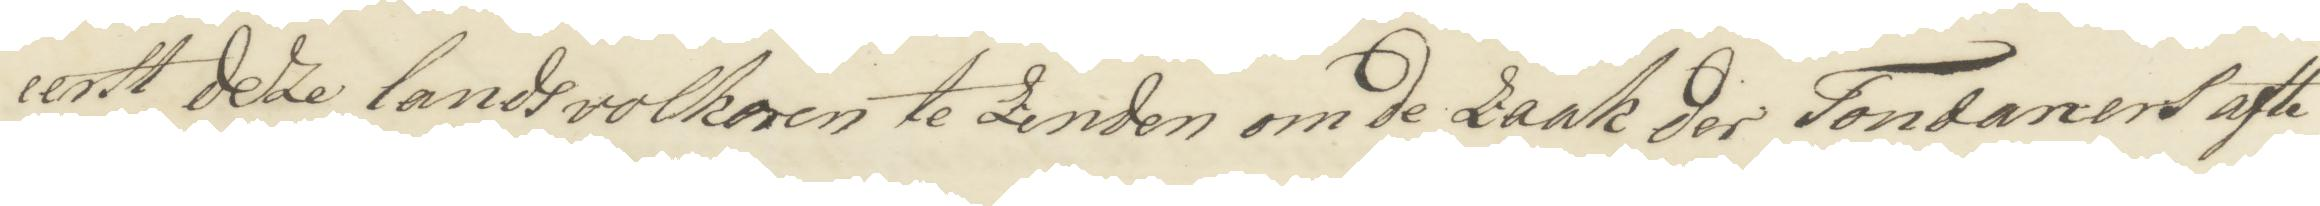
eerst deze lands volkoren te zenden om de zaak der Tondaners afte
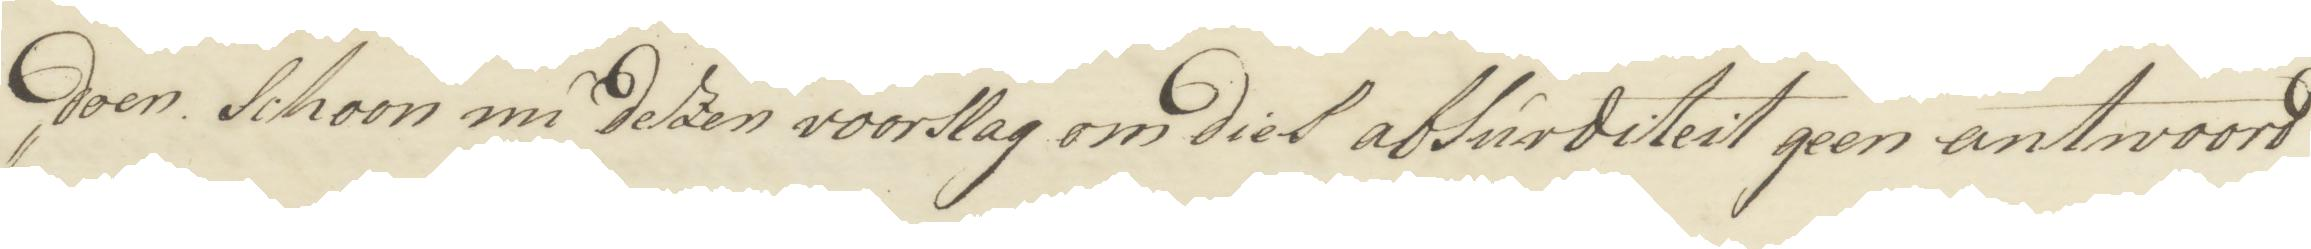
„doen schoon nu dezen voorslag om dies absurditeit geen antwoord
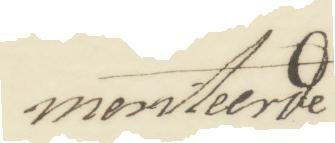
meriteerde
